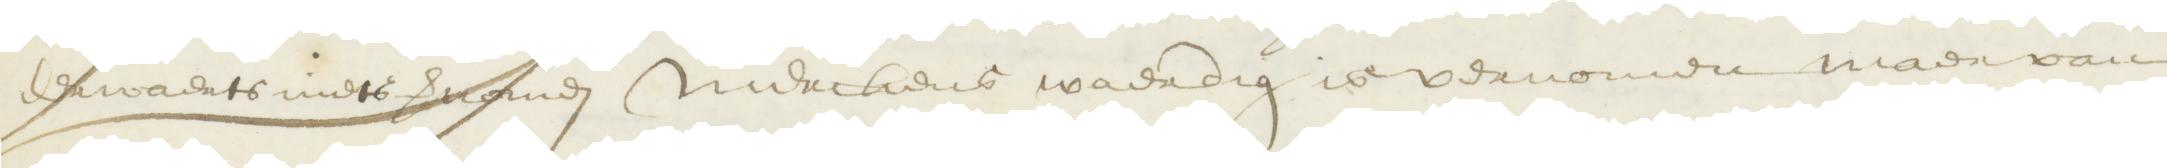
derwaerts niets vernomen merckens waerdig is vernomen maer van
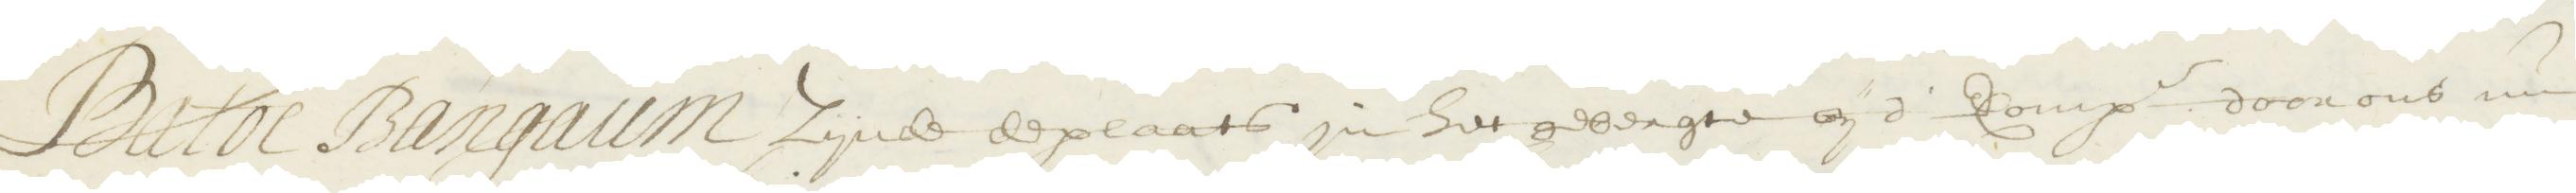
Batoe Bangaum zijnde deplaats jn het gebergte en„ d’ EComp:e door ons uw
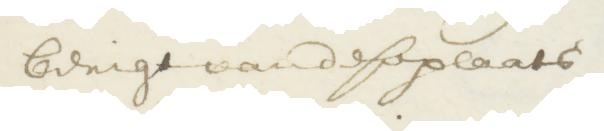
berigt van dese plaats
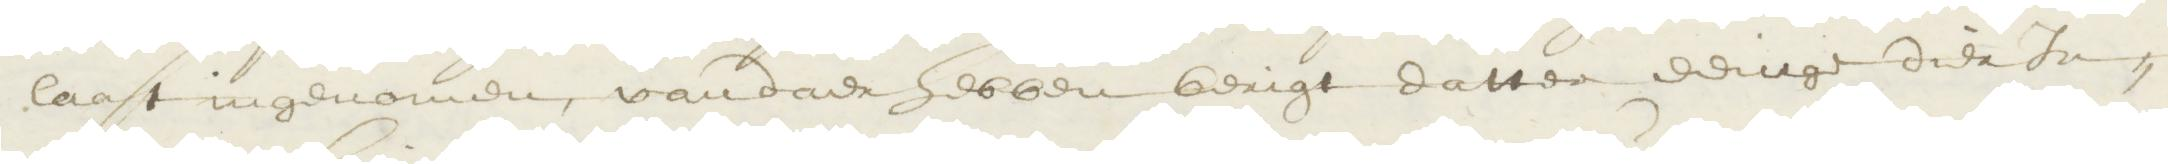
laast ingenomen, van daer hebben berigt datter eenige dier In„
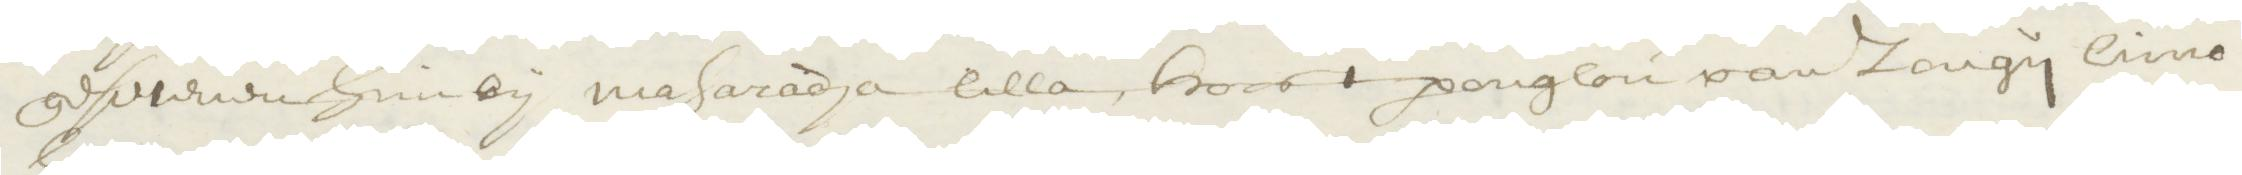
gesetenen hun bij maharadja lilla, hoost ponglou van Zongij limo
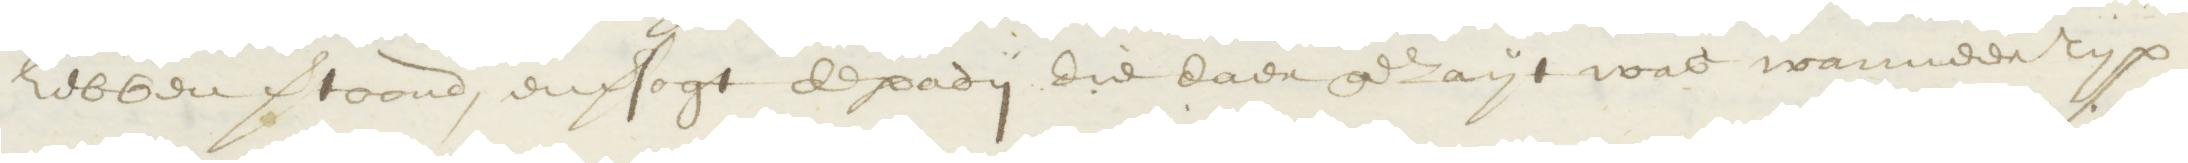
hebben vertoond, en versogt de padij die daer gezaijt was wanneer rijp
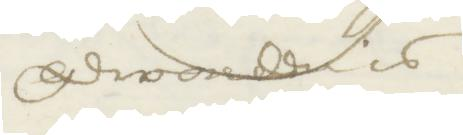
geworden is
